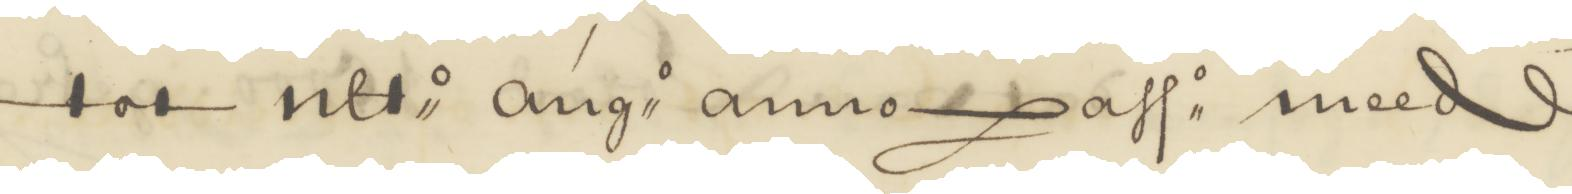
tot ult„o aug„o anno pass„o meede
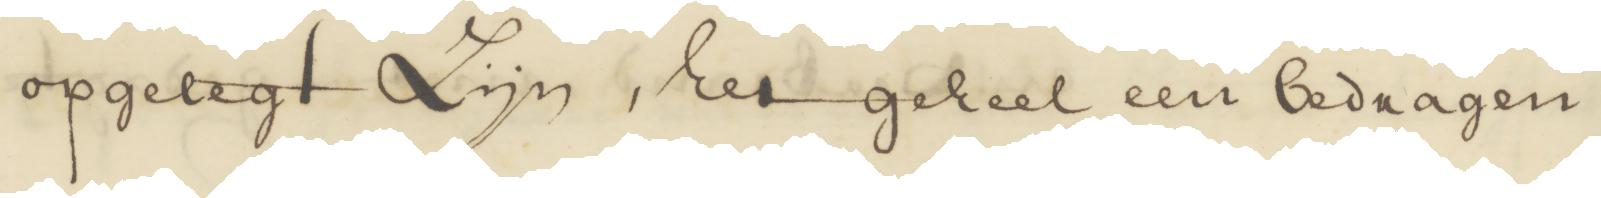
opgelegt zijn, het geheel een bedragen
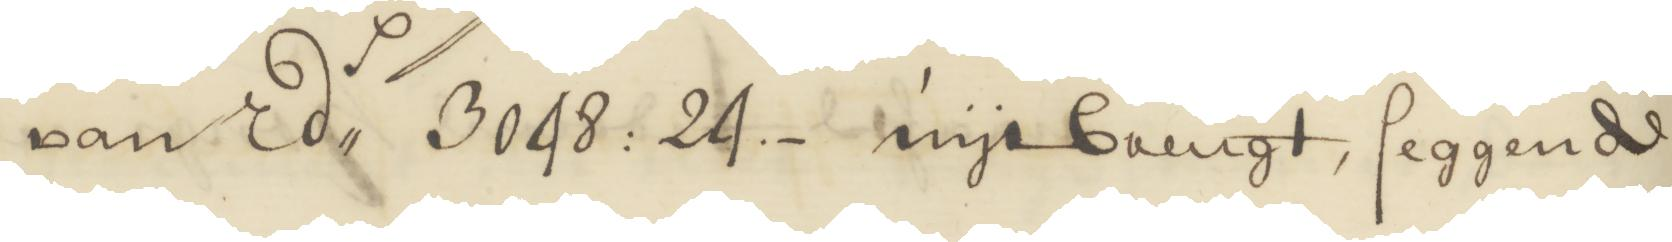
van rd„s 3048:24.- uijtbrengt, seggende
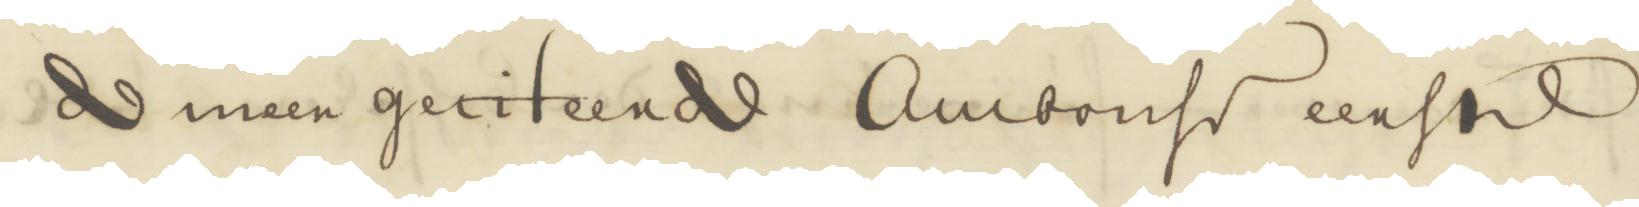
de meer geciteerde Ambonse eerste
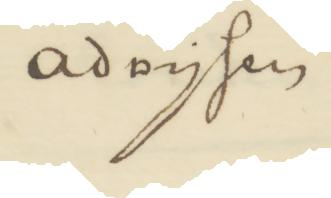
advijsen
